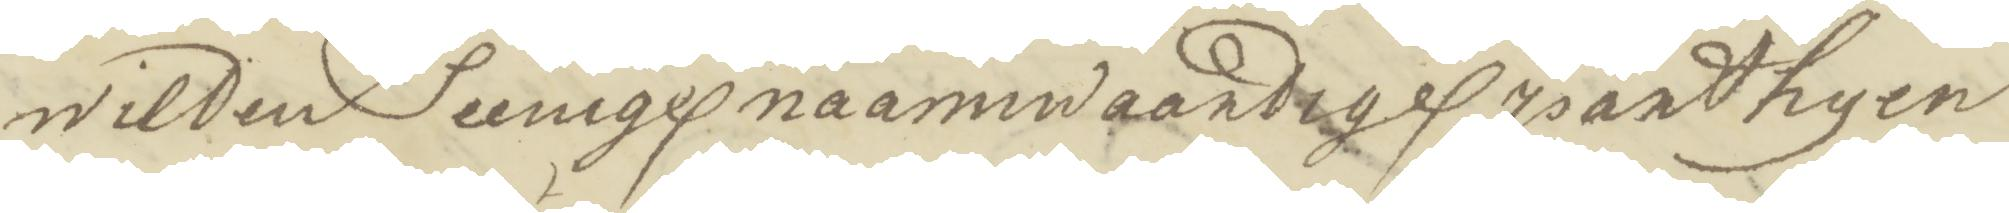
wilden Se enige naamwaardige parthyen
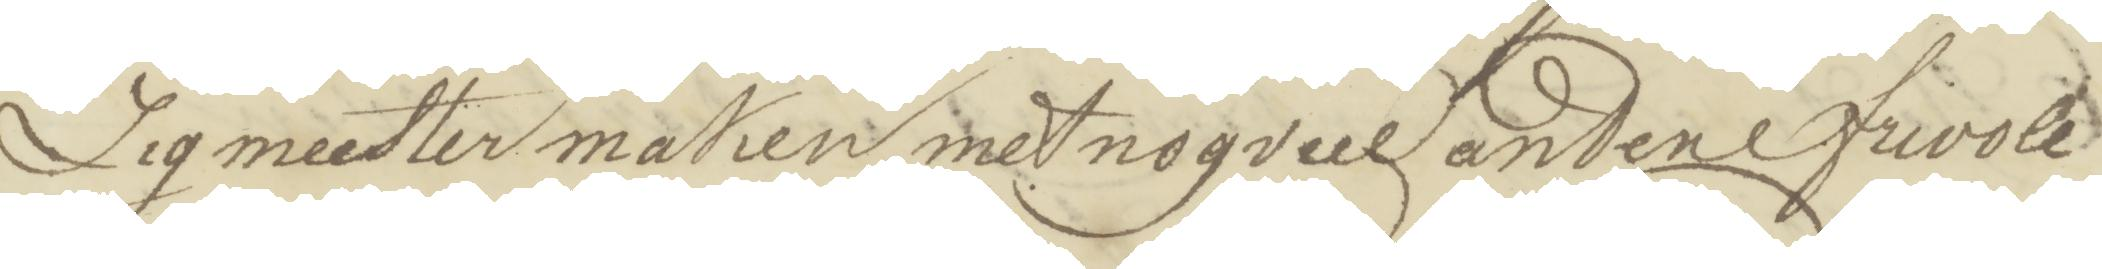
Zig meester maken met nog veel andere frivole
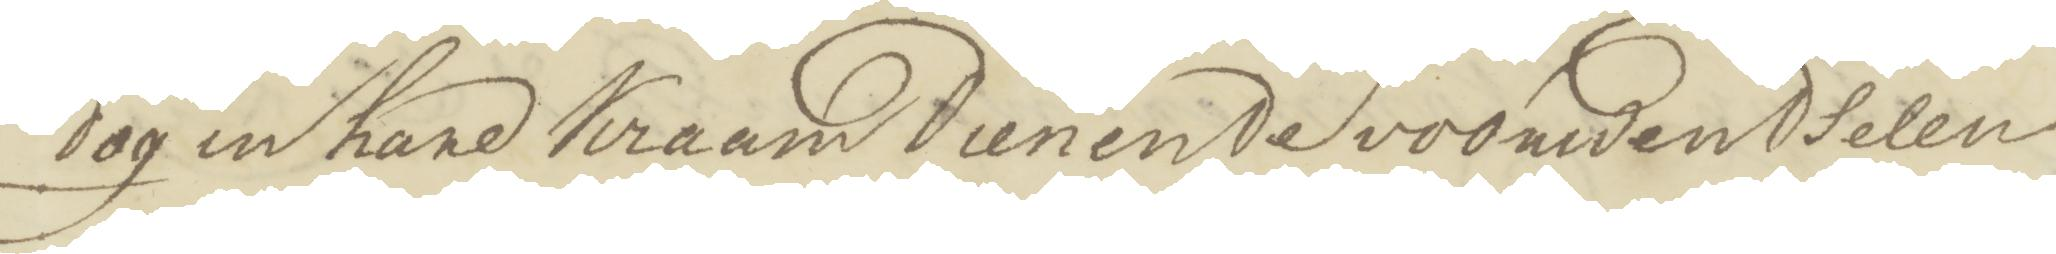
dog in hare Kraam dienende voorwendselen
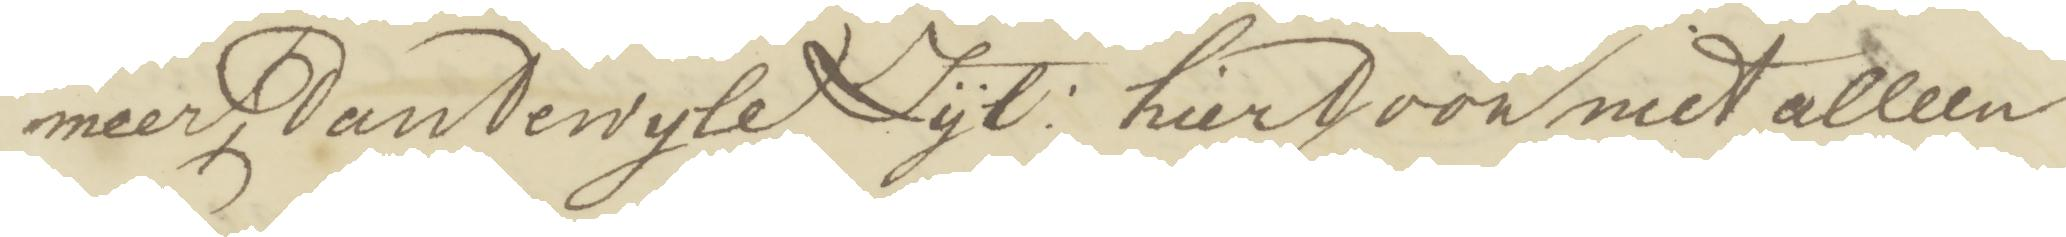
meer dan de wyle Zij l: hierdoor niet alleen
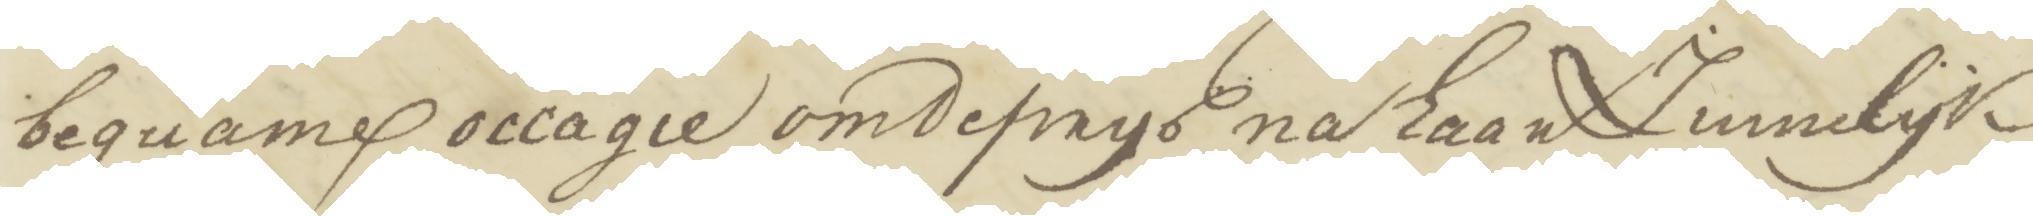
bequame occagie om de prijs na haar Zinnelijk
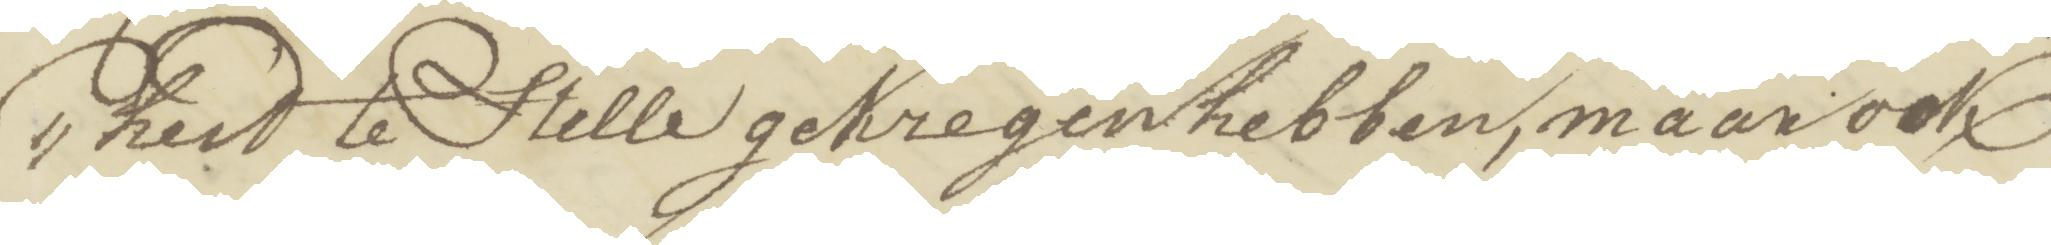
„heid te stelle gekregen hebben, maar ook
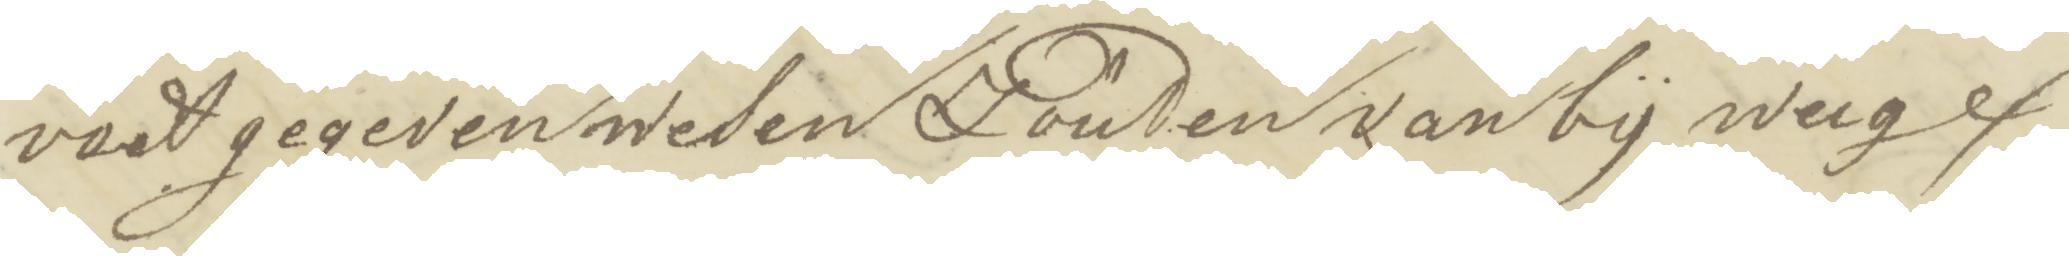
voet gegeven wesen Zouden van bij weige
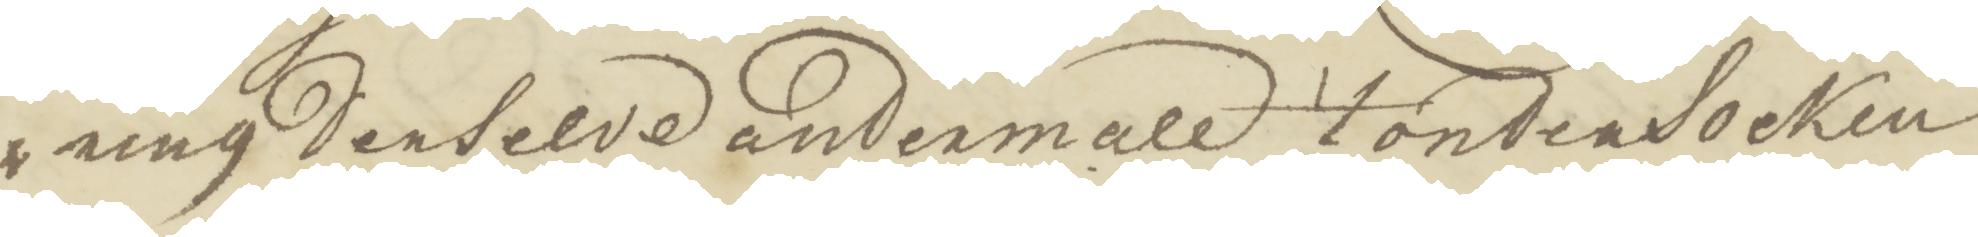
ring derselve andermale 't ondersoeken
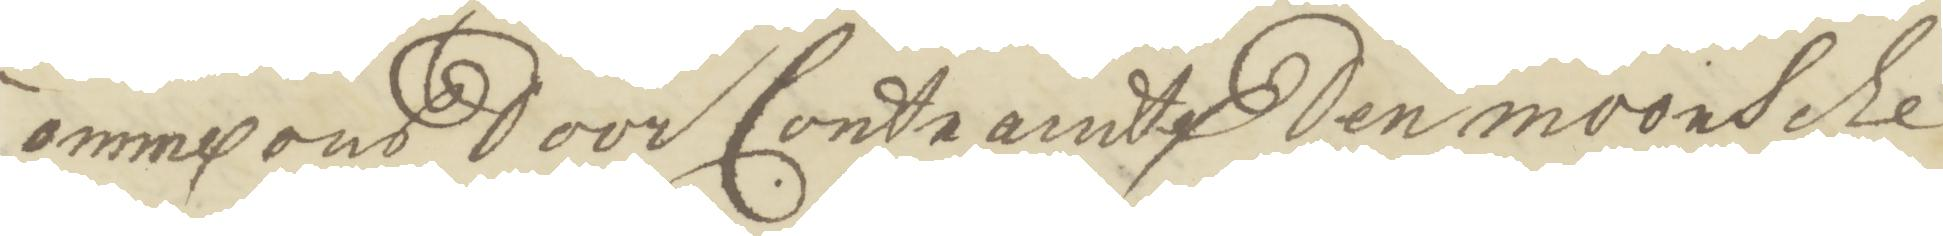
omme ons door Contrainte den moorsche
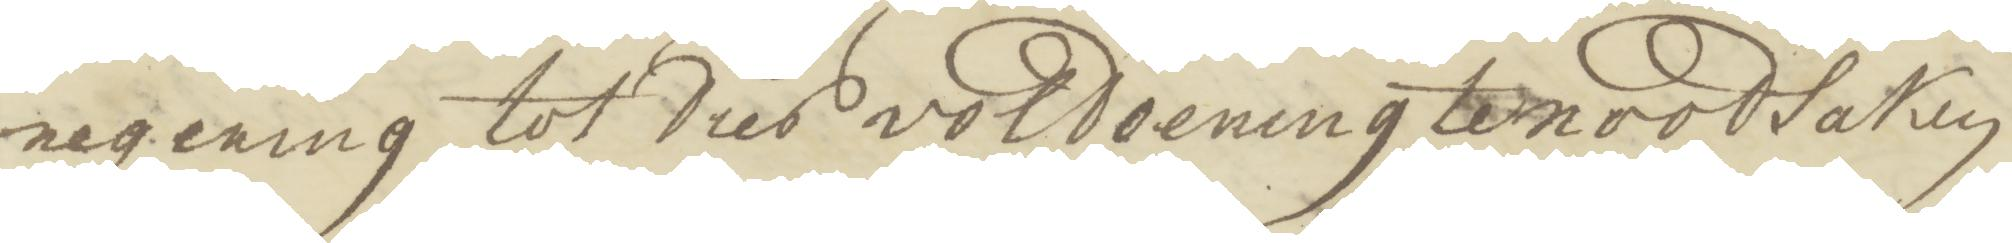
regering tot dies voldoening te noodsaken
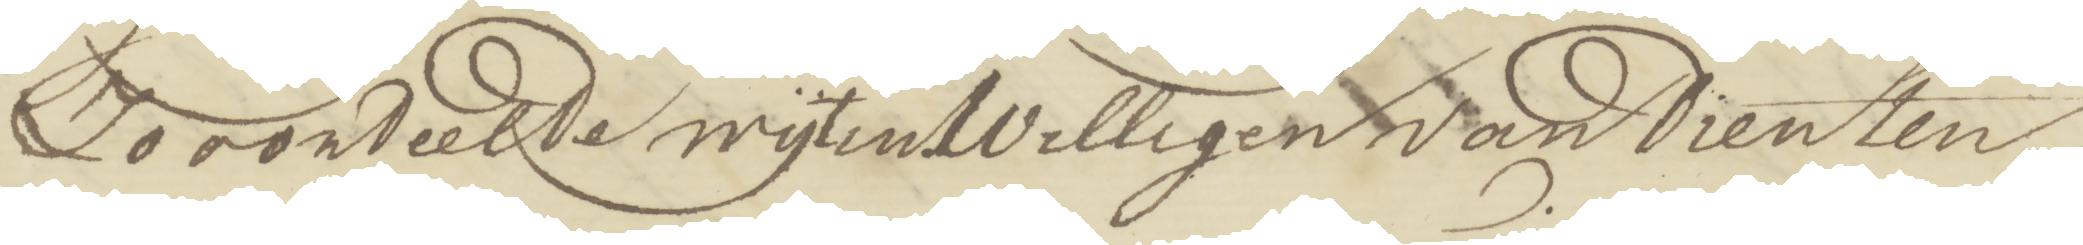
Zo oordeelde wij 't inwilligen van dien ten
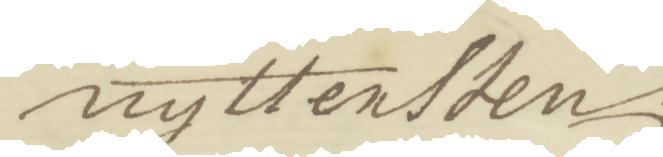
uijttersten
